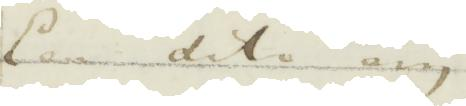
Een dito enz
